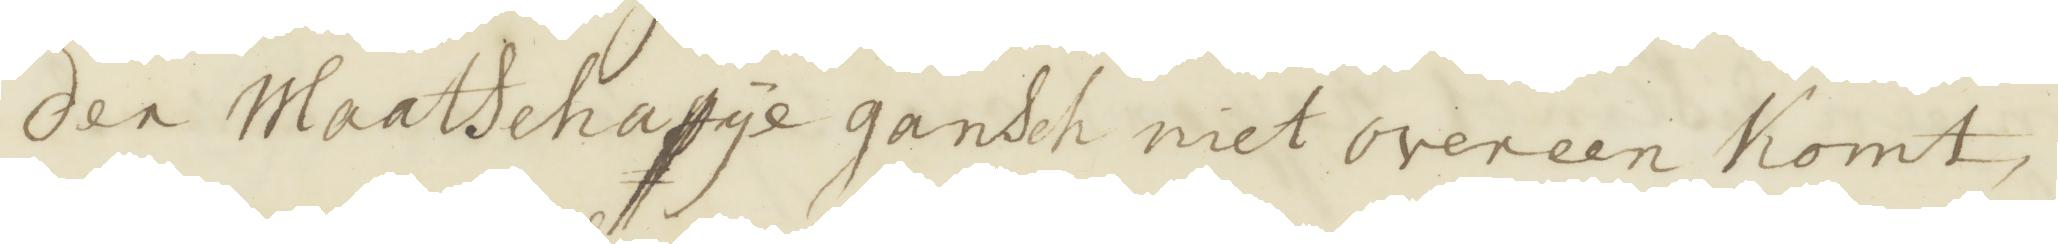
der maatschapije gansch niet overeen komt,
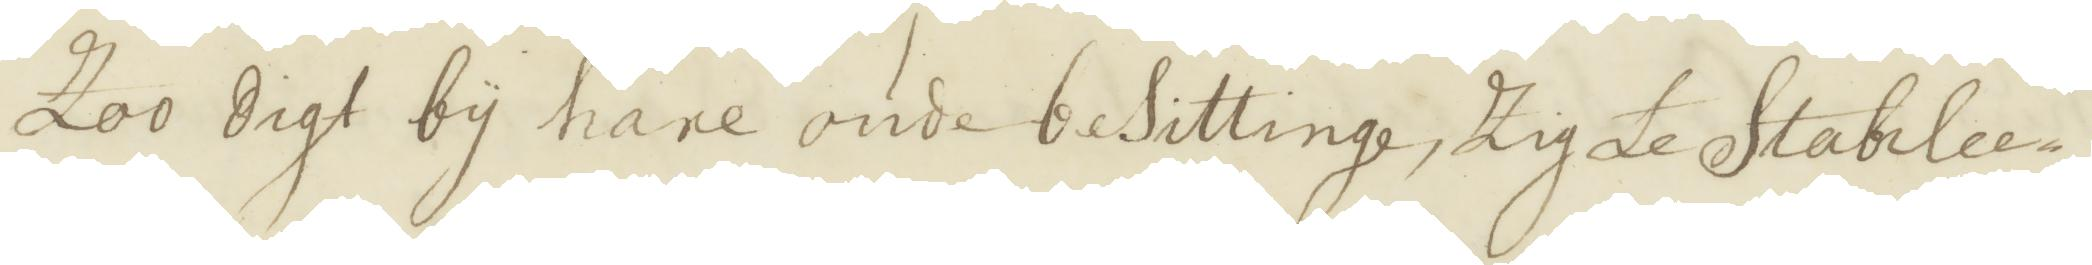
zoo digt bij hare oude besittinge, zig te stabilee„
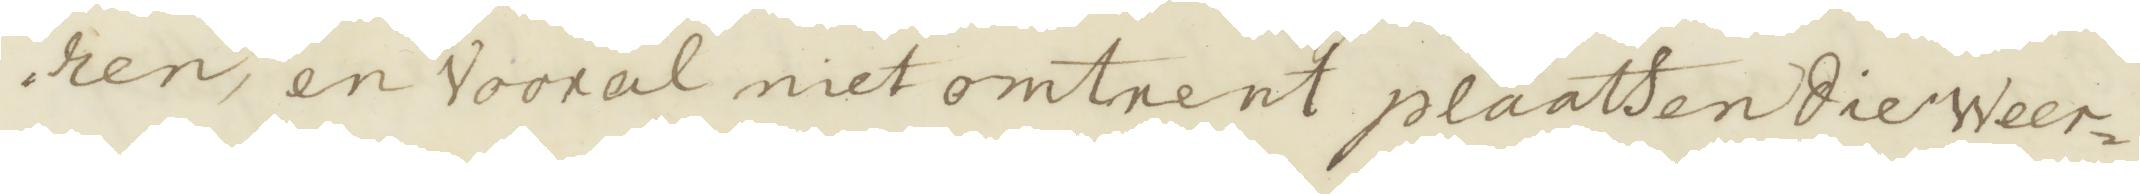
„ren, en vooral niet omtrent plaatsen die weer=
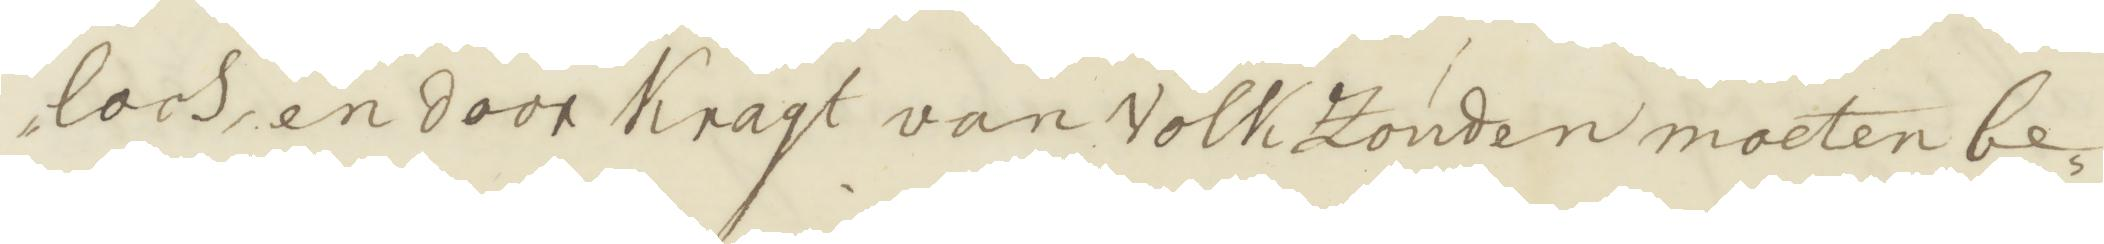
„loos, en door kragt van volk zouden moeten be„
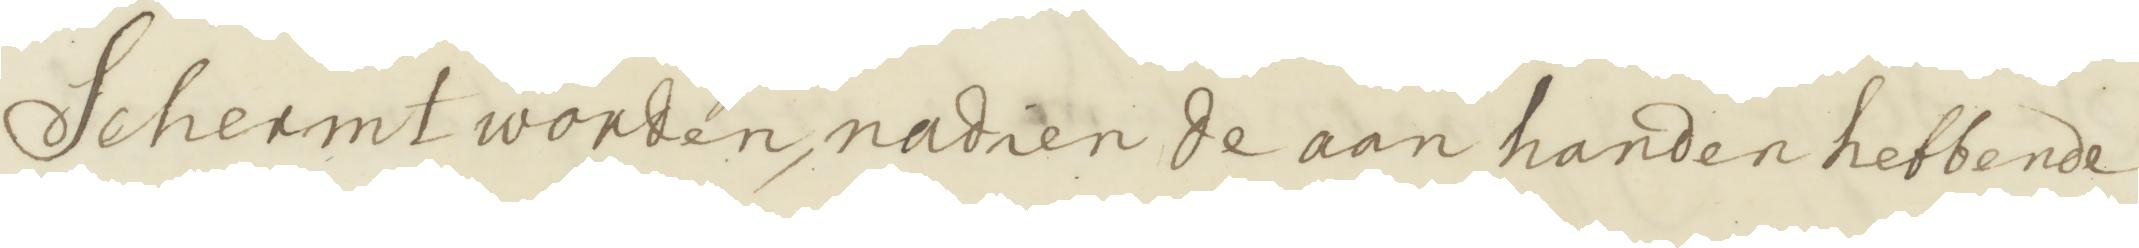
schermt worden, nadien de aan handen hebbende
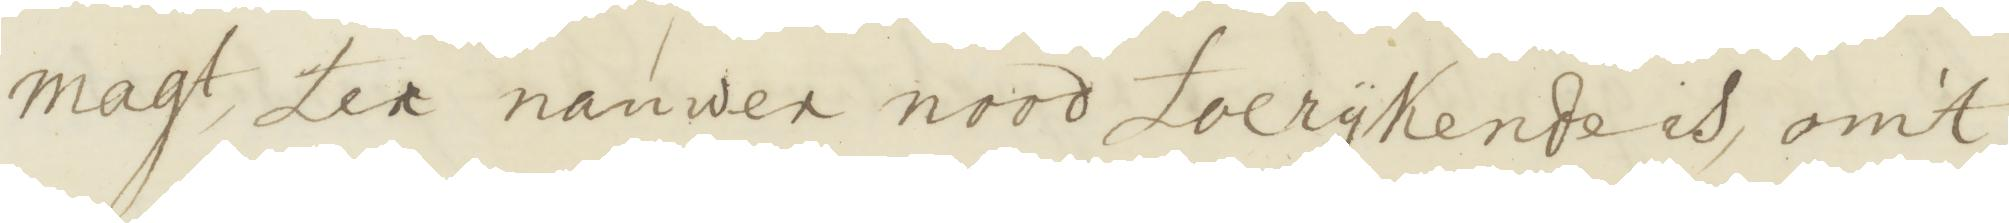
magt, ter nauwer nood toerijkende is, om’t
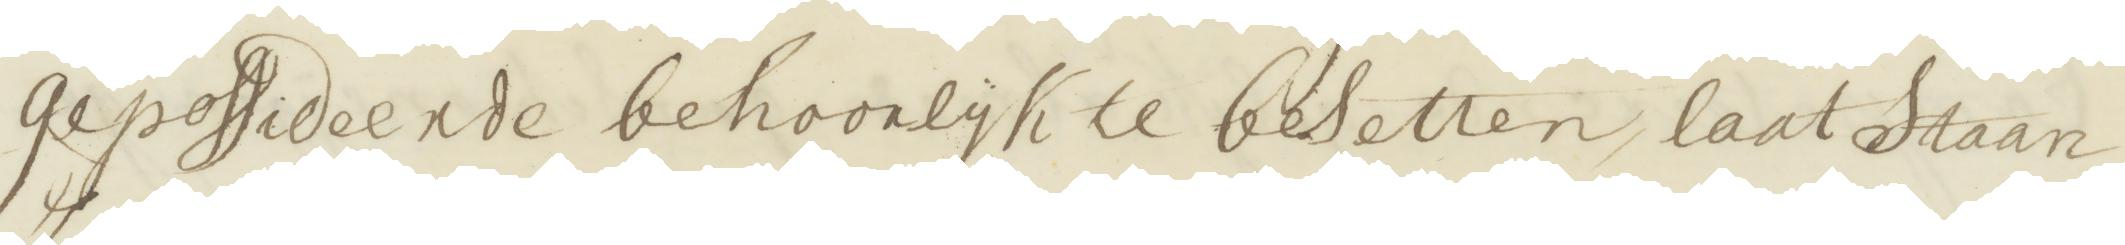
gepossideerde behoorlijk te besetten, laat staan
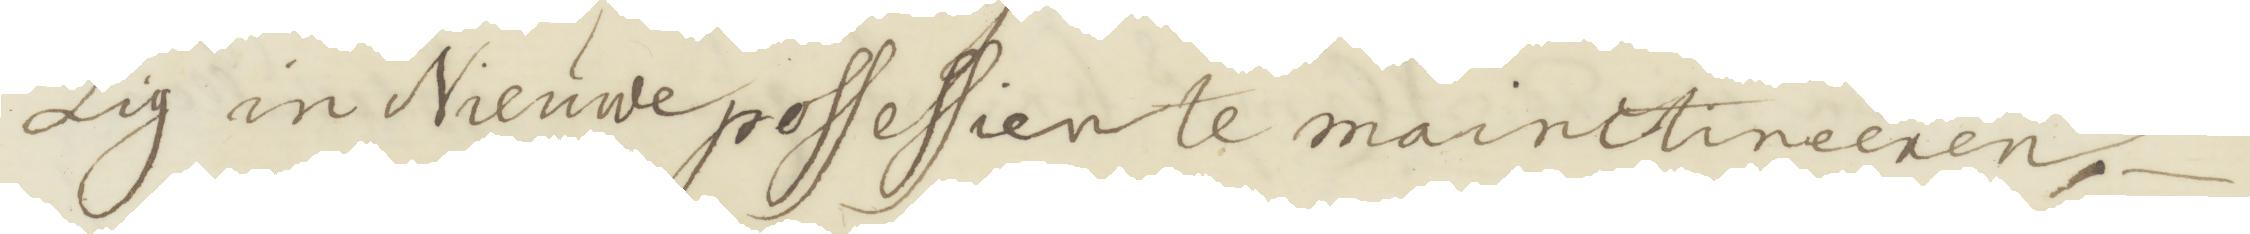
zig in Nieuwe possessien te mainctineeren, —
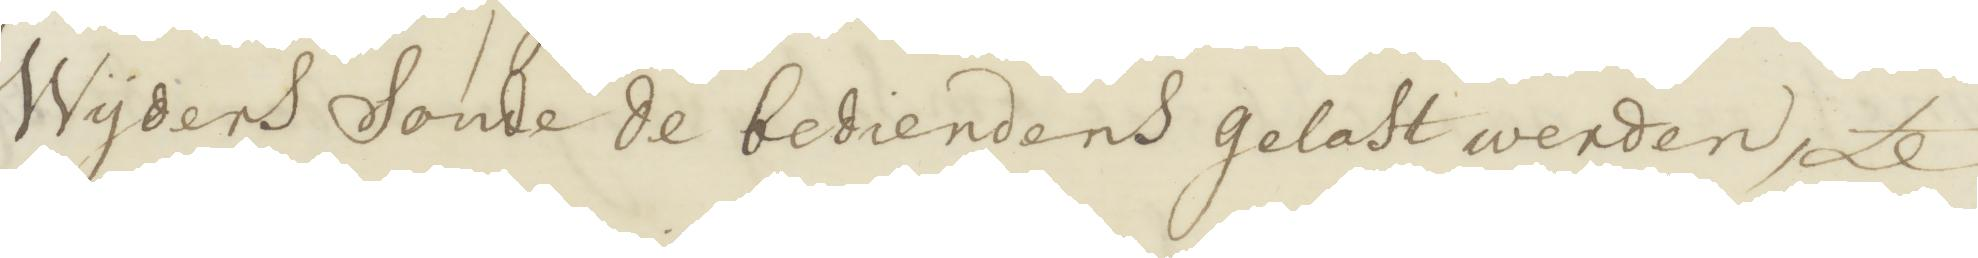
Wijders soude de bediendens gelast werden, te
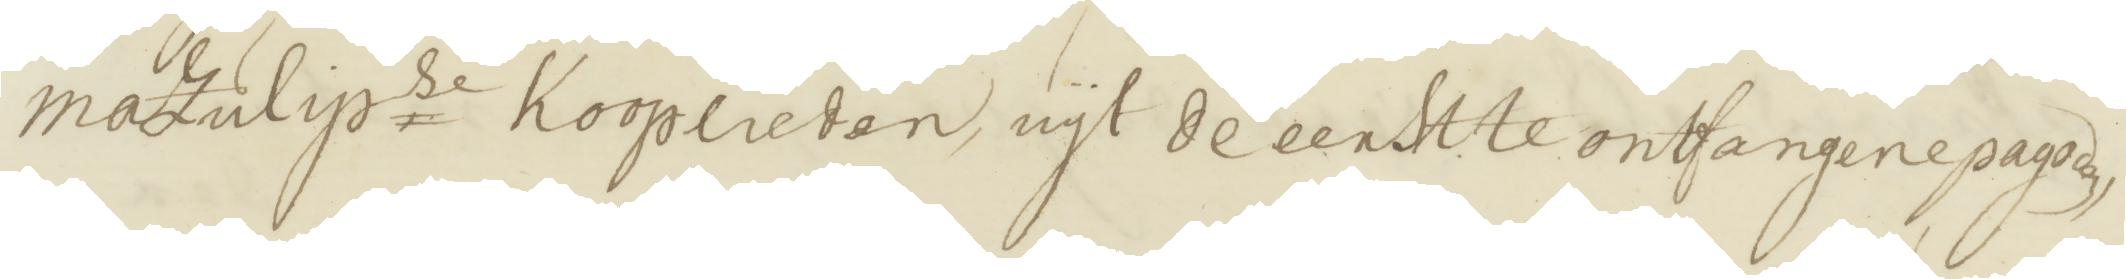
mazulip=se kooplieden, uijt de eerst te ontfangene pagoden,
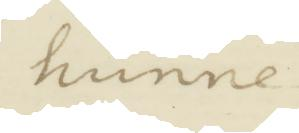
hunne
